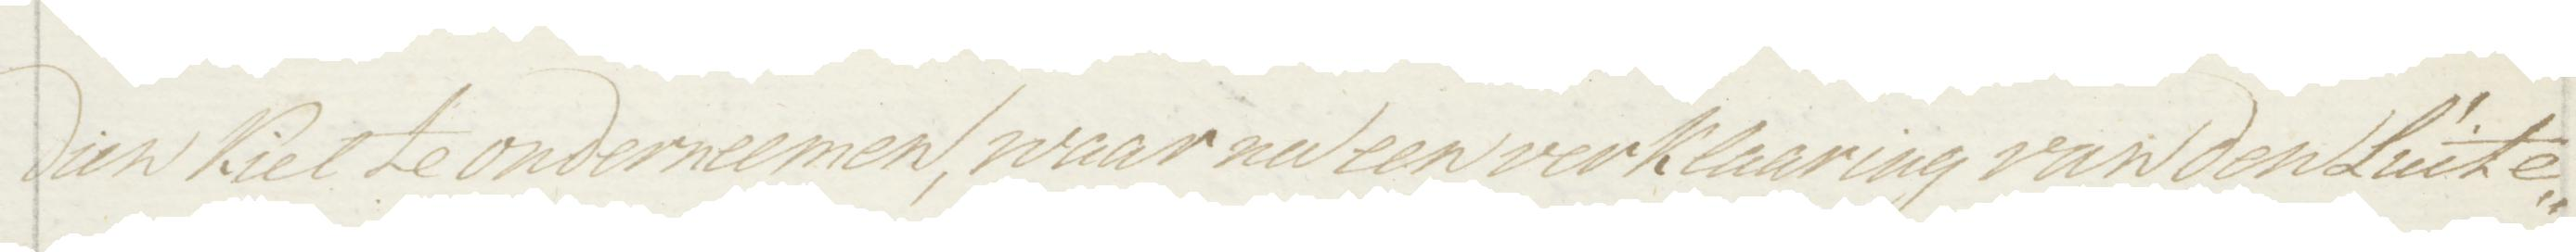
dien kiel te onderneemen, waar na een verklaaring van den Luite„
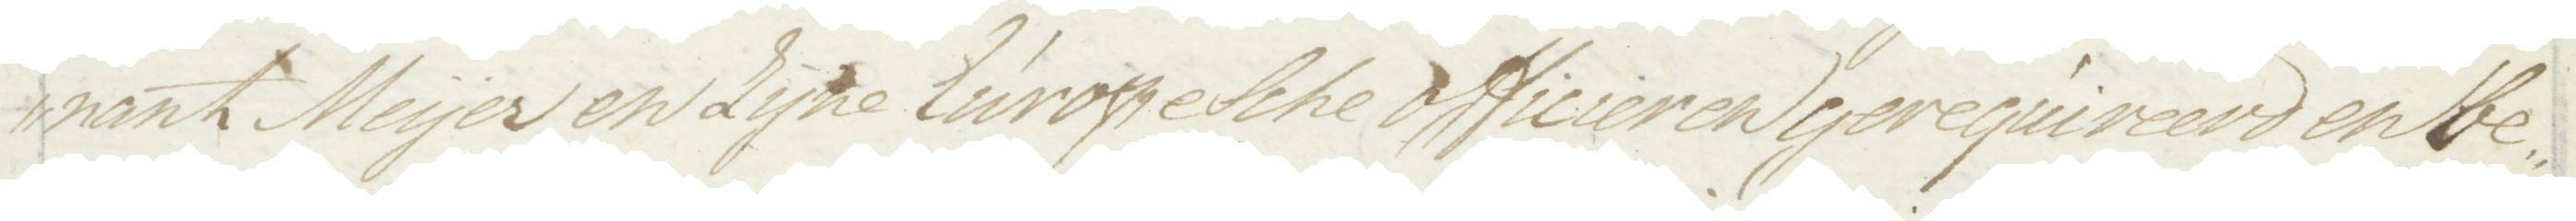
„nant Meijer en Zijne Europesche officieren gerequireerd en be„
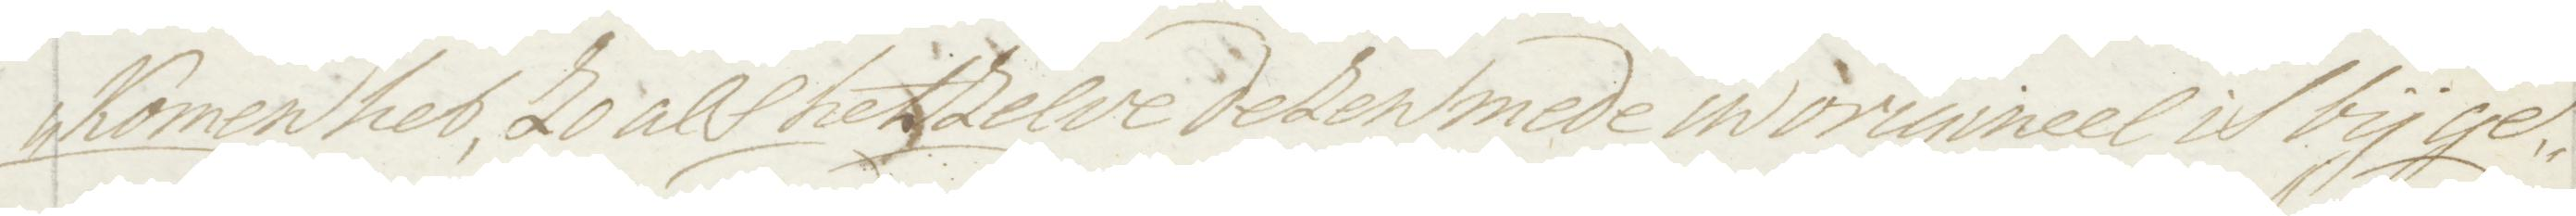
„Komen heb, Zo als het Zelve dezen mede in origineel is bij ge„
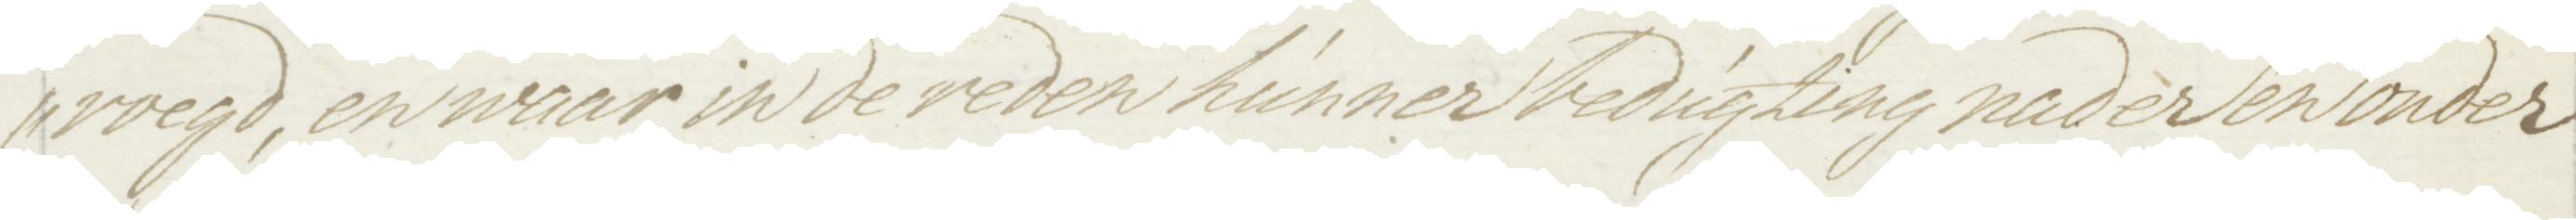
„voegd, en waar in de reden hunner bedugting nader en onder
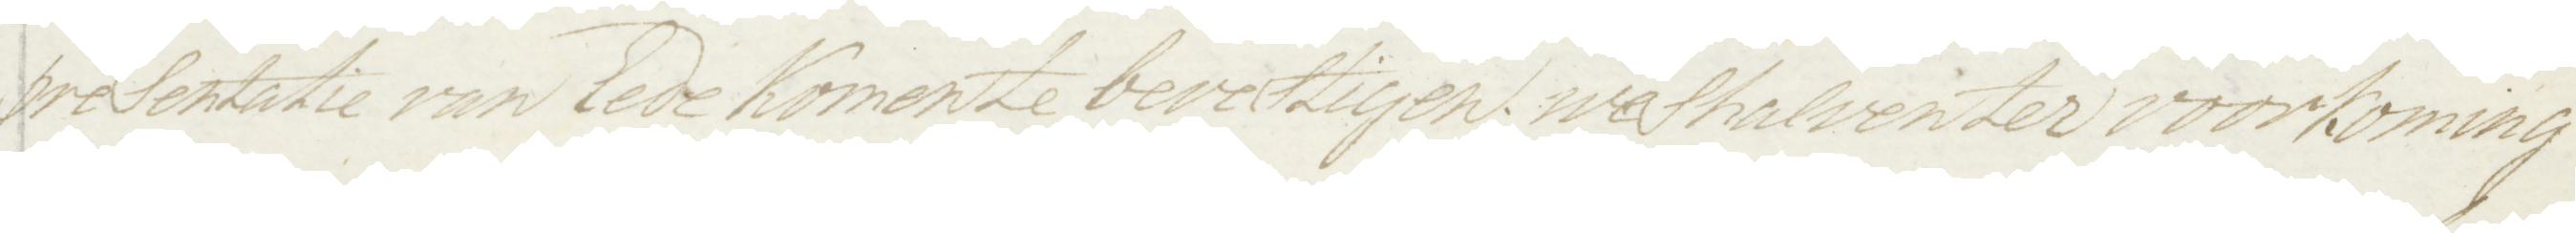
presentatie van Eede Komen te bevestigen; weshalven ter voorkoming
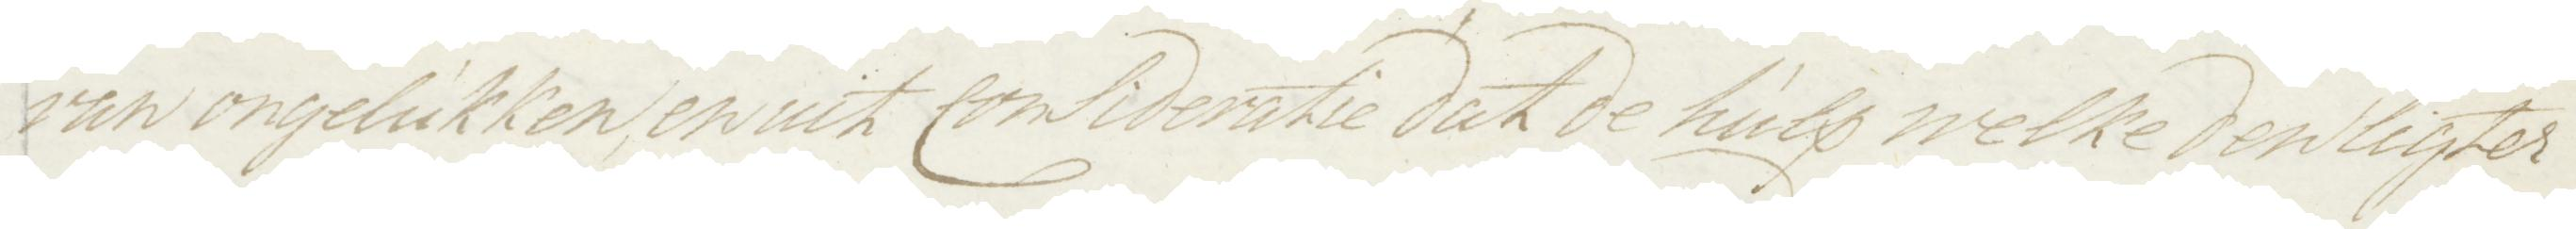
van ongelukken, en uit consideratie dat de hulp welke den ligter
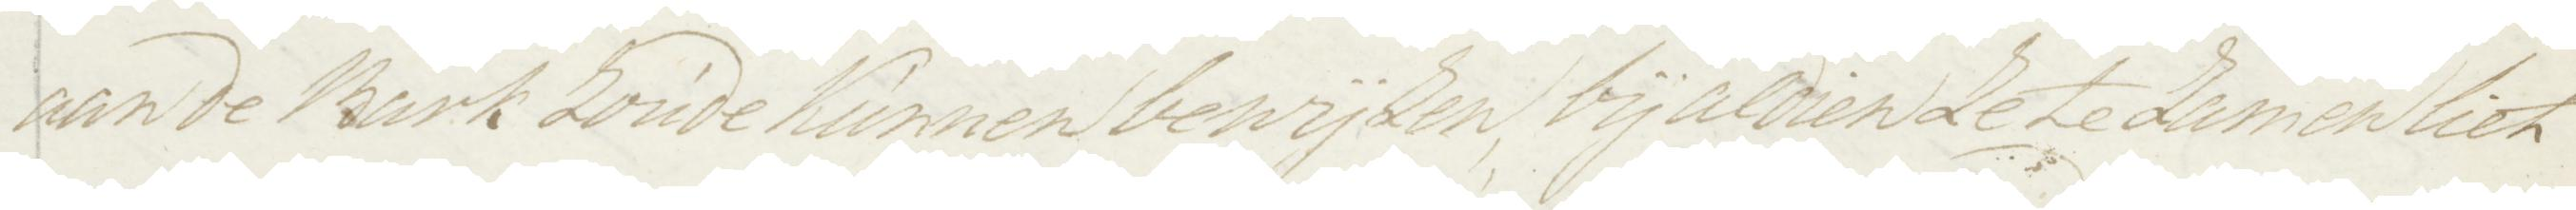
aan de Bark Zoude kunnen bewijzen, bij aldien Ze te zamen liet
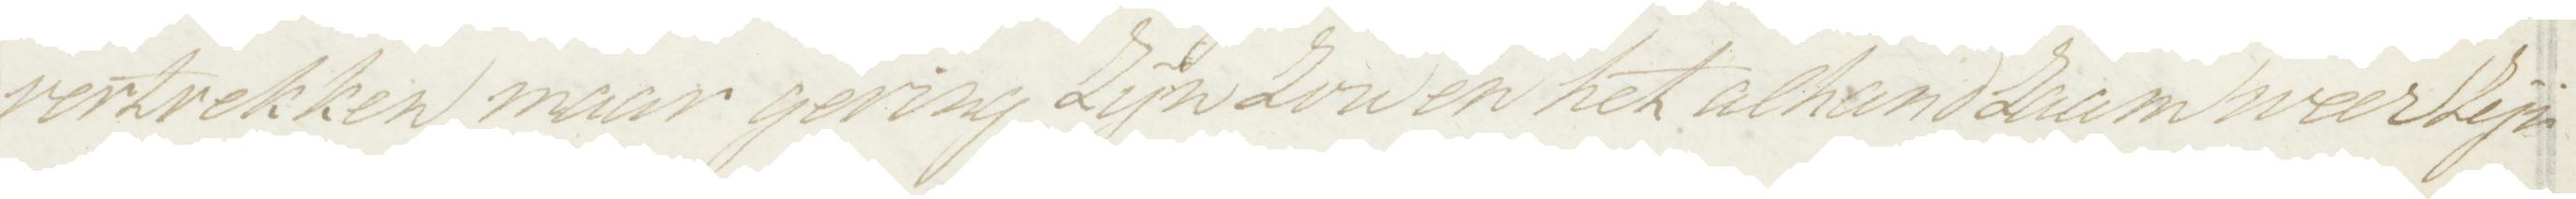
vertrekken maar gering Zijn Zou en het alhandzaam weer Zijn
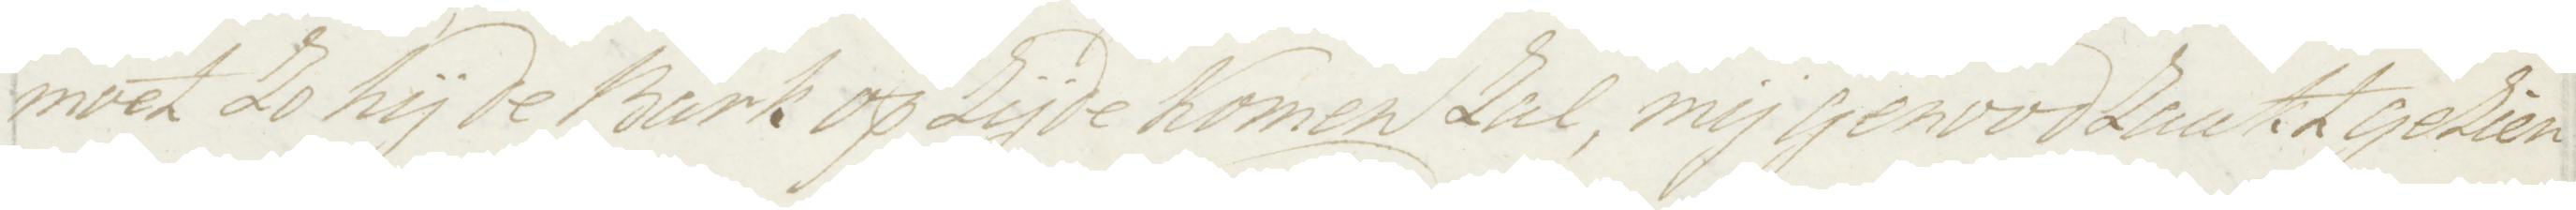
moet Zo hij de Bark op Zijde Komen Zal, mij genoodzaakt gezien
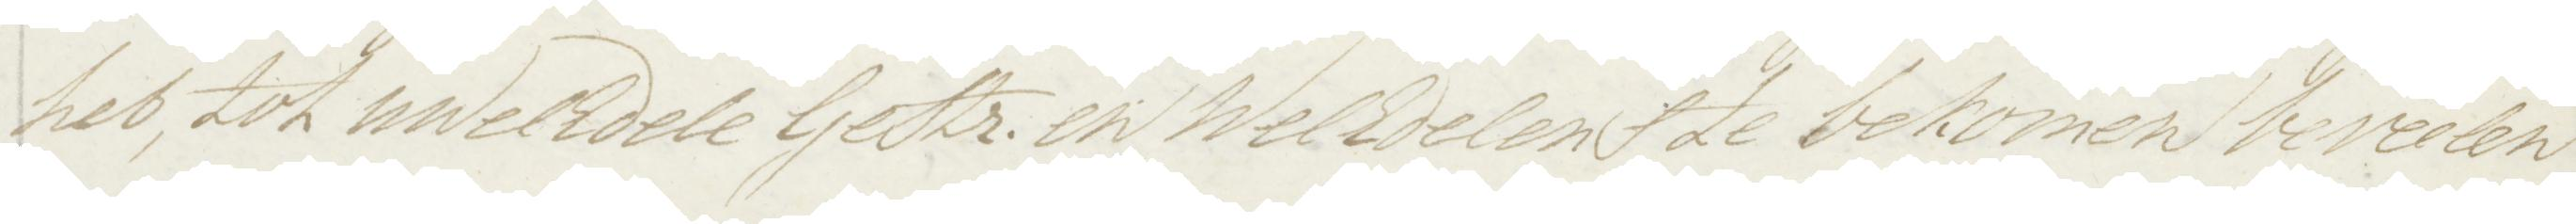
heb, tot uwel Edele Gestr: en Wel Edelens te bekomen beveelen
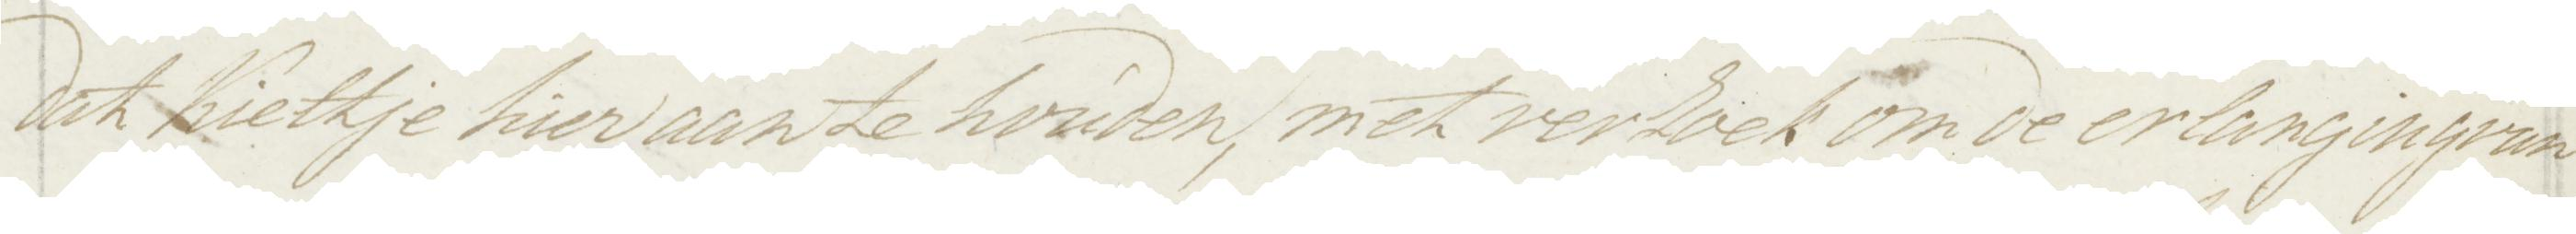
dat Kieltje hier aan te houden, met verzoek om de erlanging van
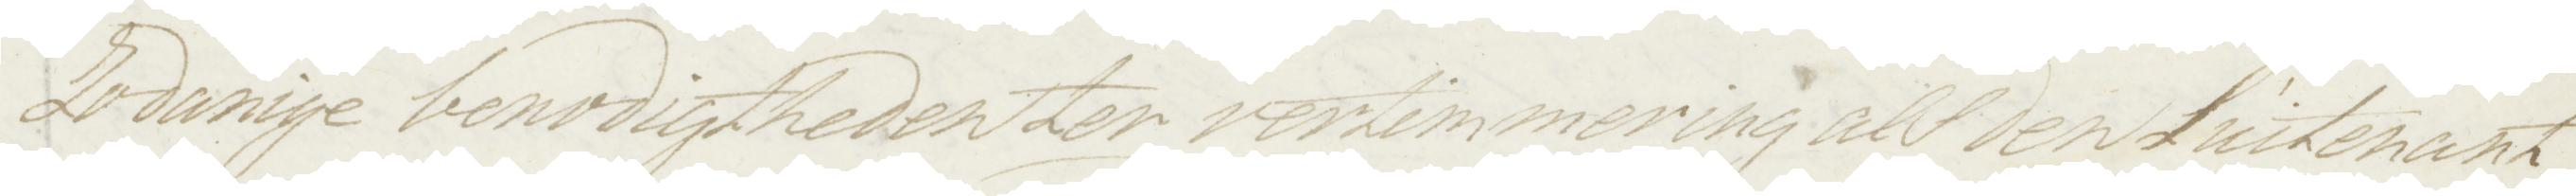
Zodanige benodigtheden ter vertimmering als den Luitenant
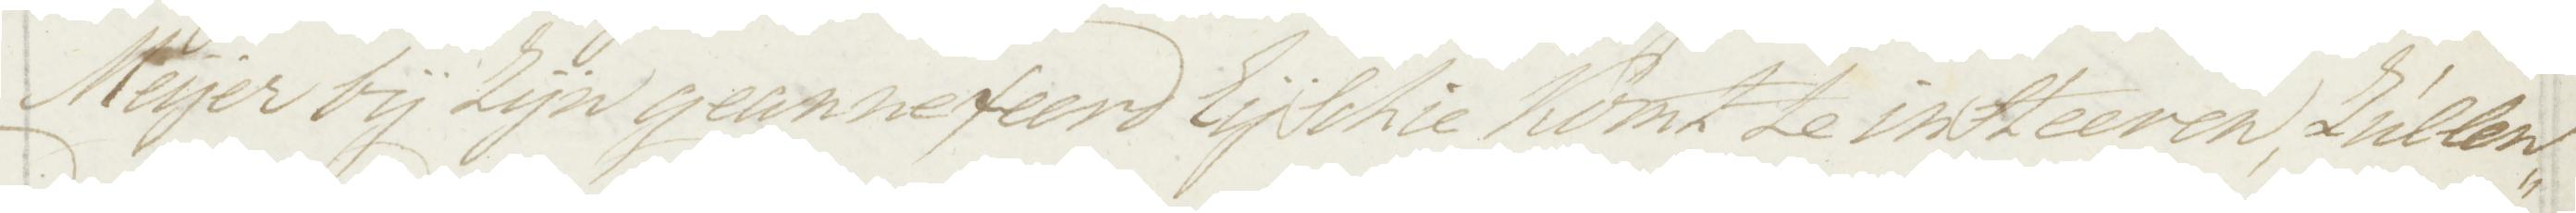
Meijer bij Zijn geannexeerd Eijschie Komt te insteeren, Zullen„
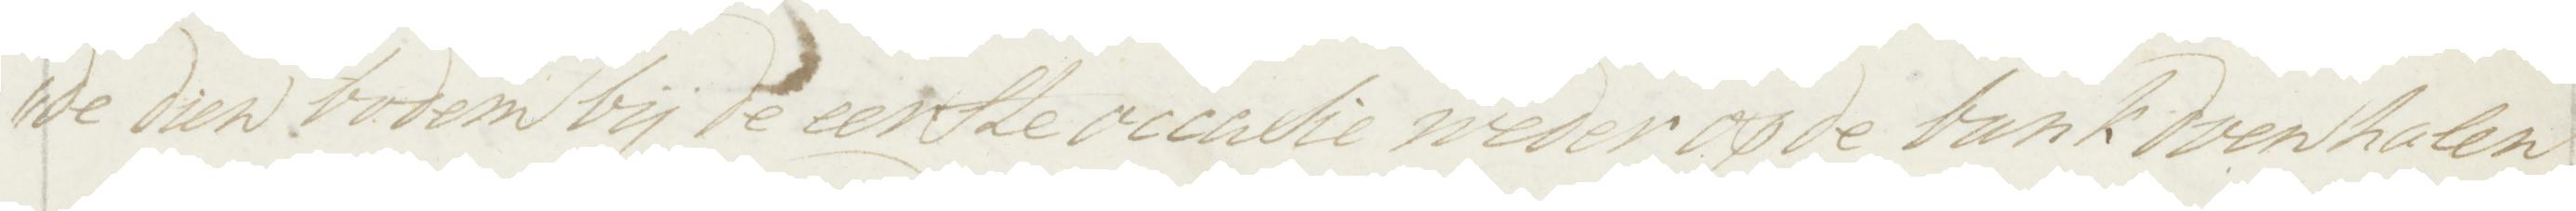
„de dien bodem bij de eerste occasie weder op de bank doen halen
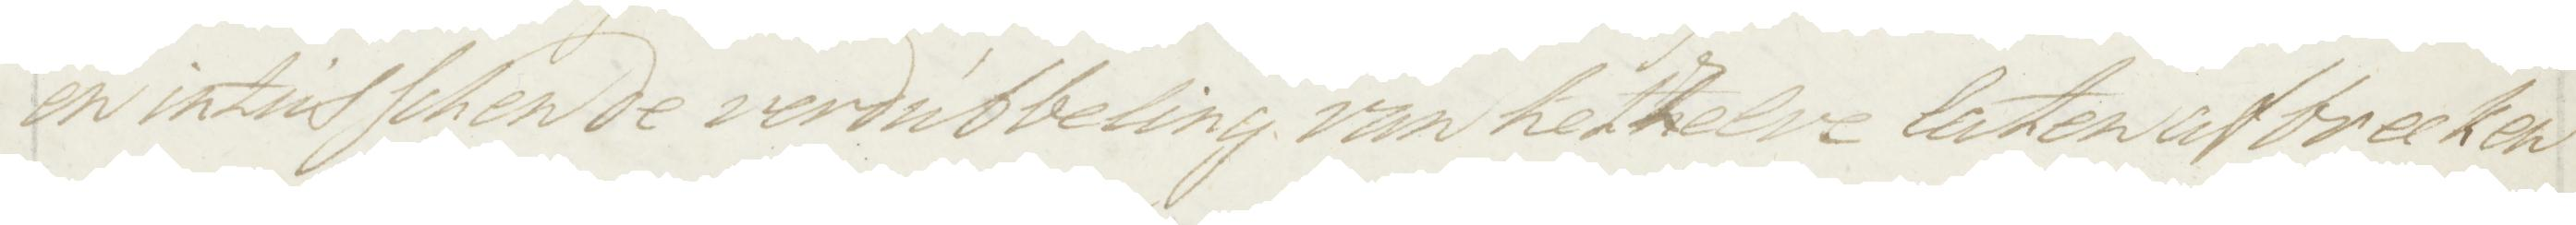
en intusschen de verdubbeling van het Zelve laten afbreeken
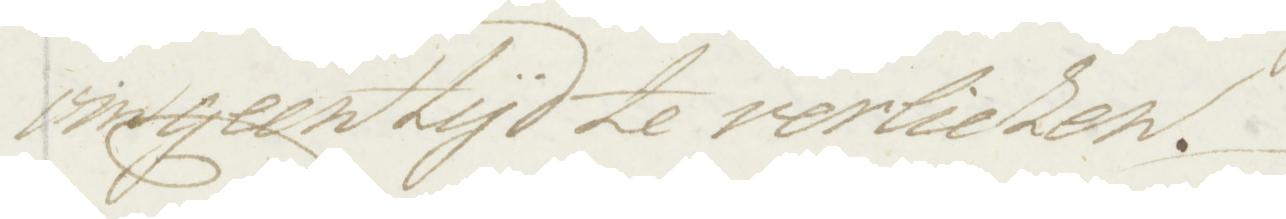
om geen tijd te verliezen.
